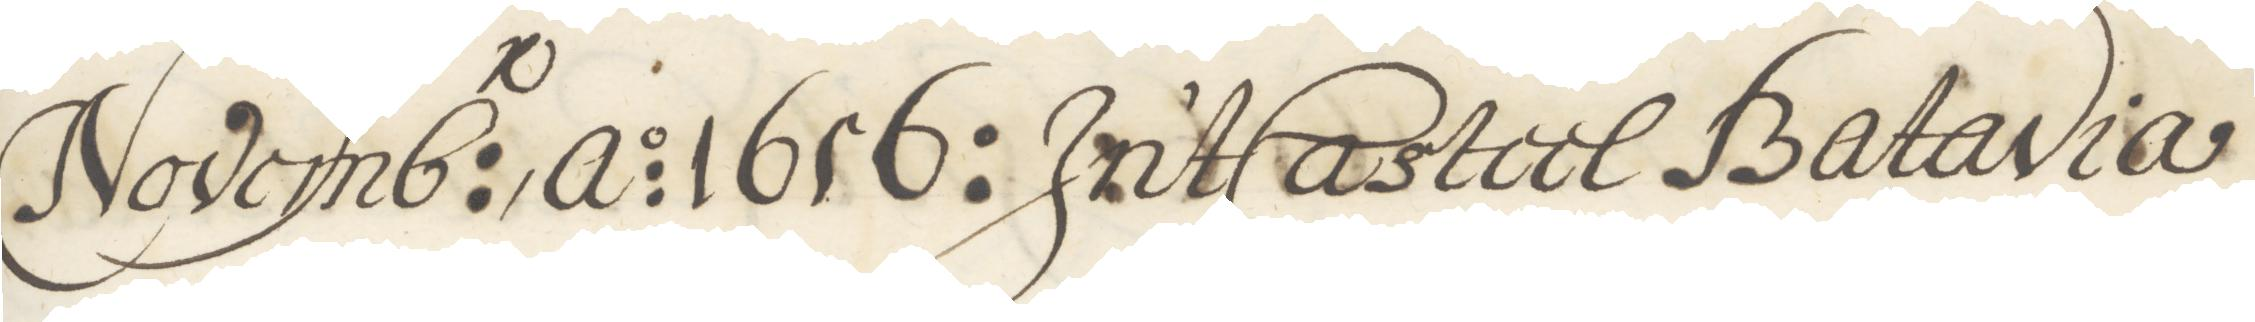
Novemb:r, a:o 1656: In 't Casteel Batavia
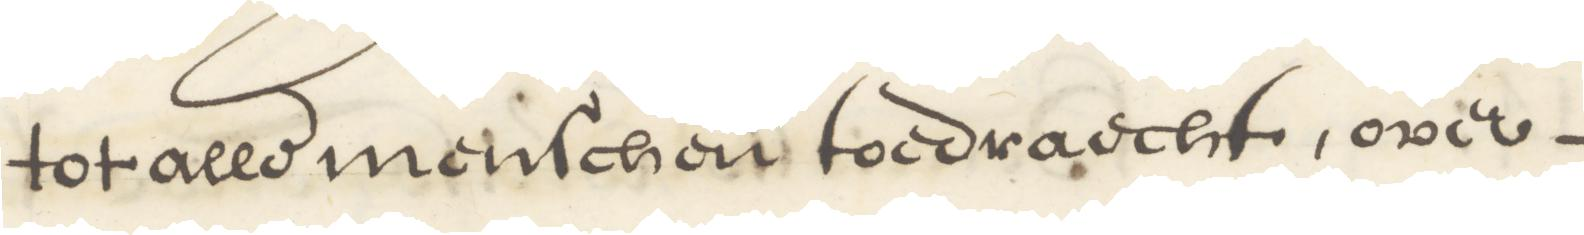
tot alle menschen toedraecht, over
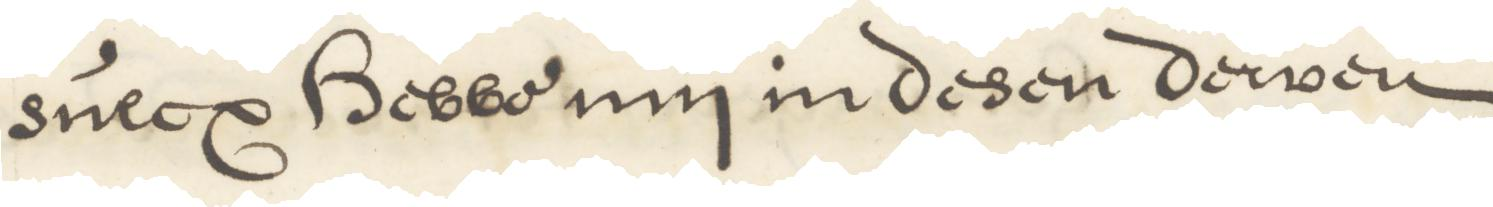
sulcx hebbe mij in desen derven
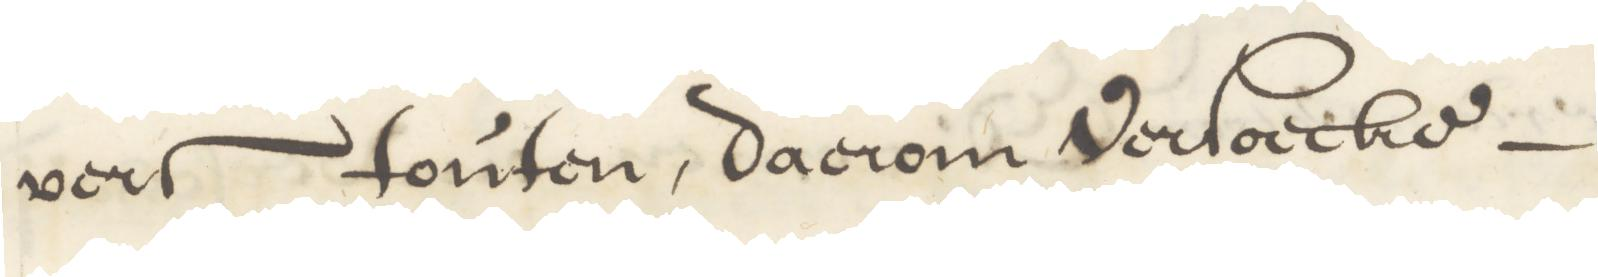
verstouten, daerom versoecke
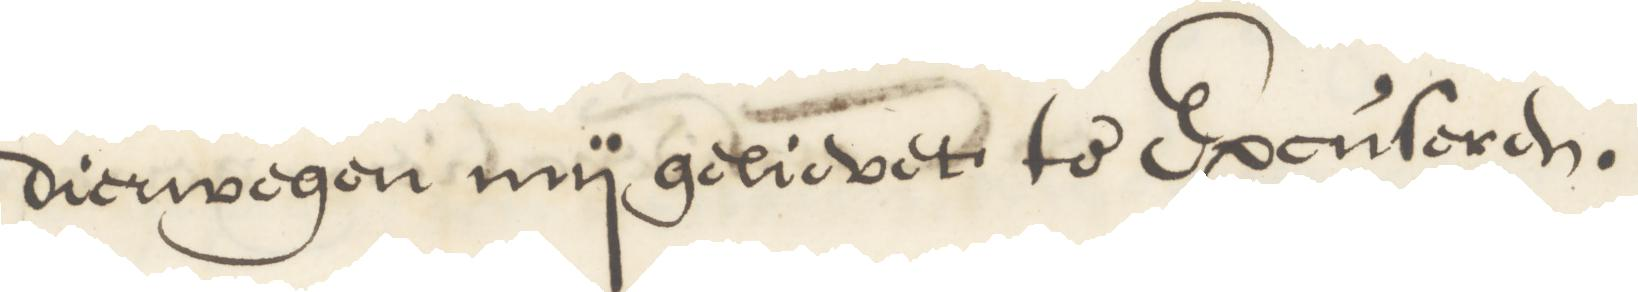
dierwegen mij gelievet te Excuseren.
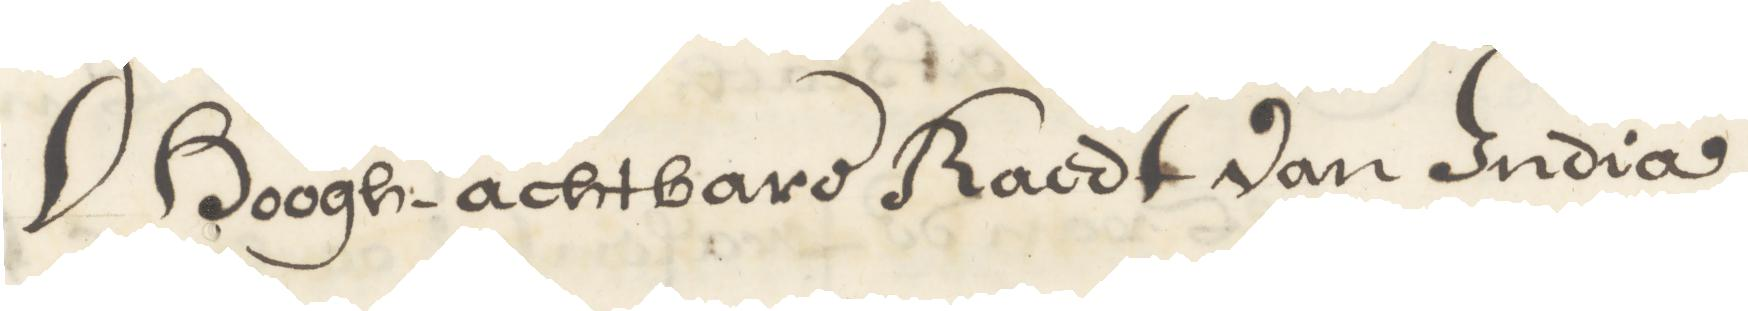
D'Hoogh-achtbare Raedt van India
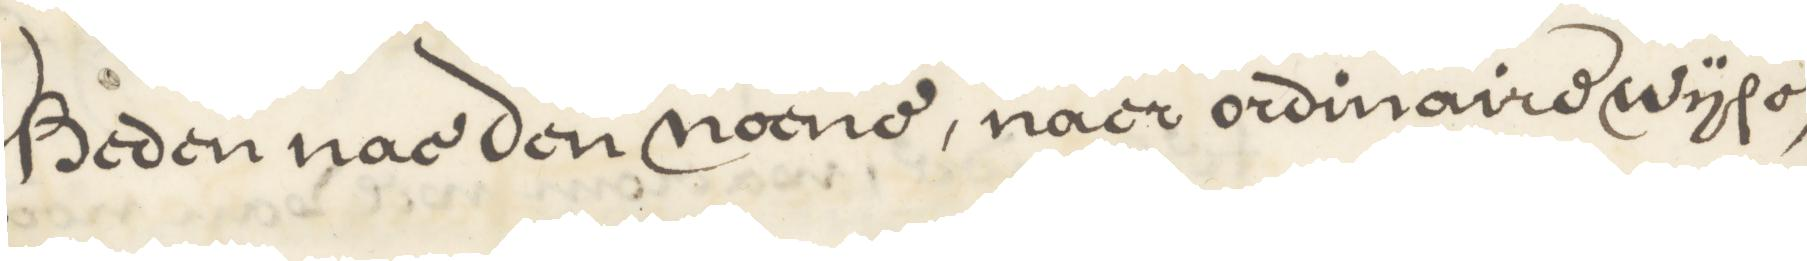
Heden nae den noene, naer ordinaire wijse,
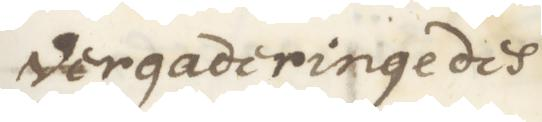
vergaderinge des
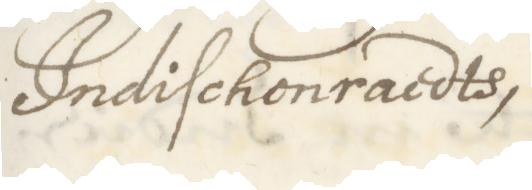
Indischen raedts,
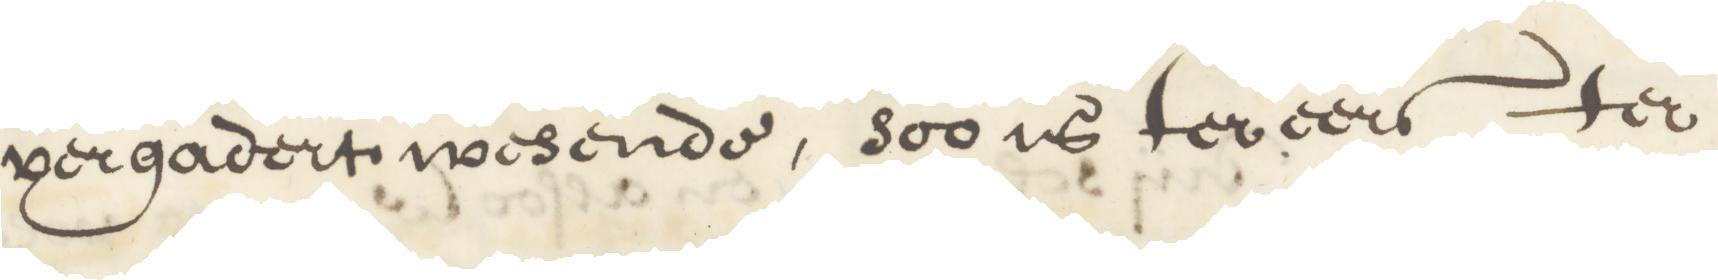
vergadert wesende, soo is ter eerster
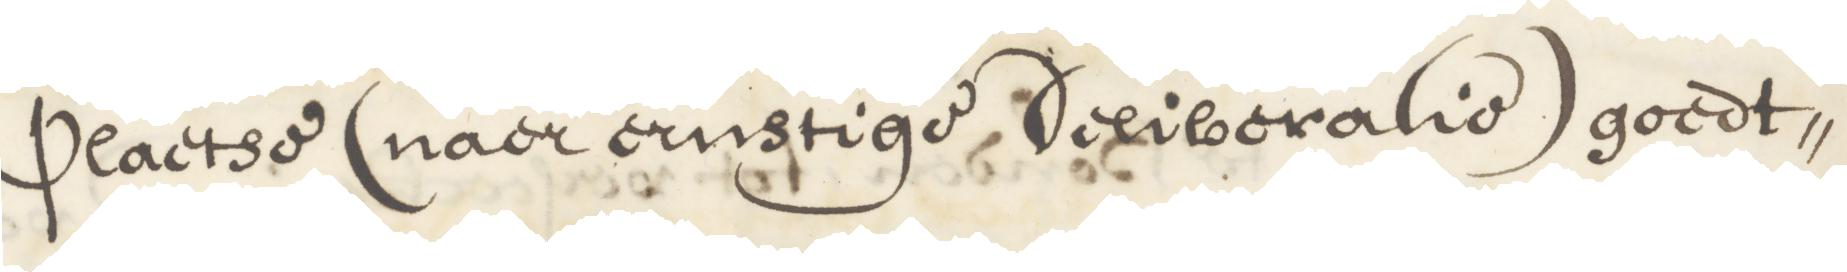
Plaetse (naer ernstige deliberatie) goedt„
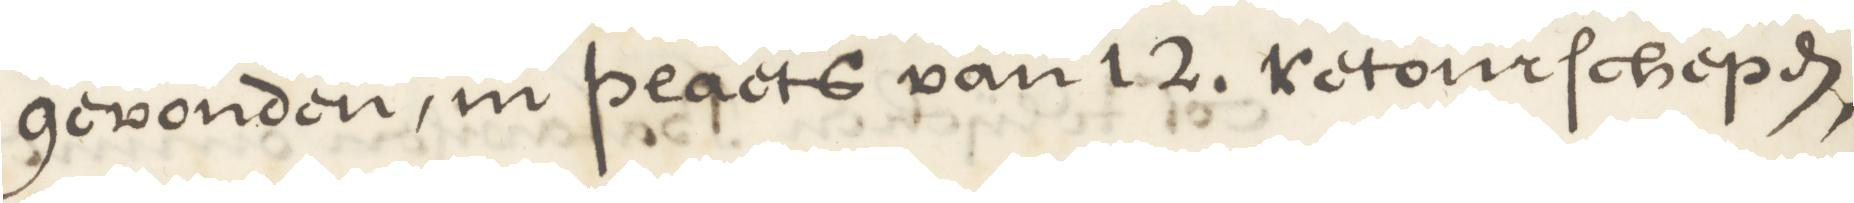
gevonden, in plaets van 12. retourschepen,
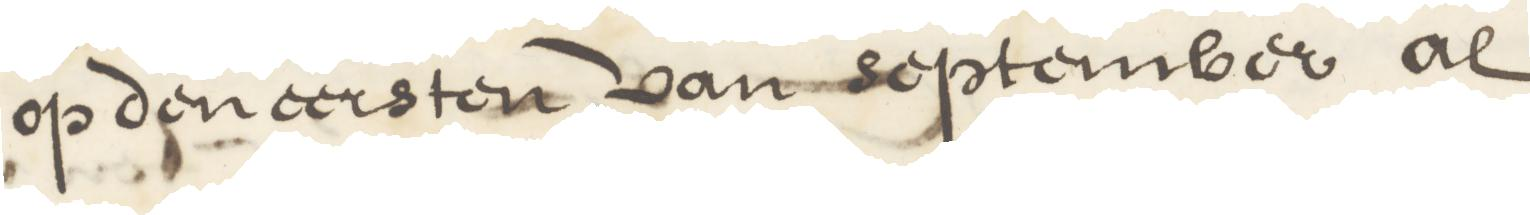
op den eersten van september al
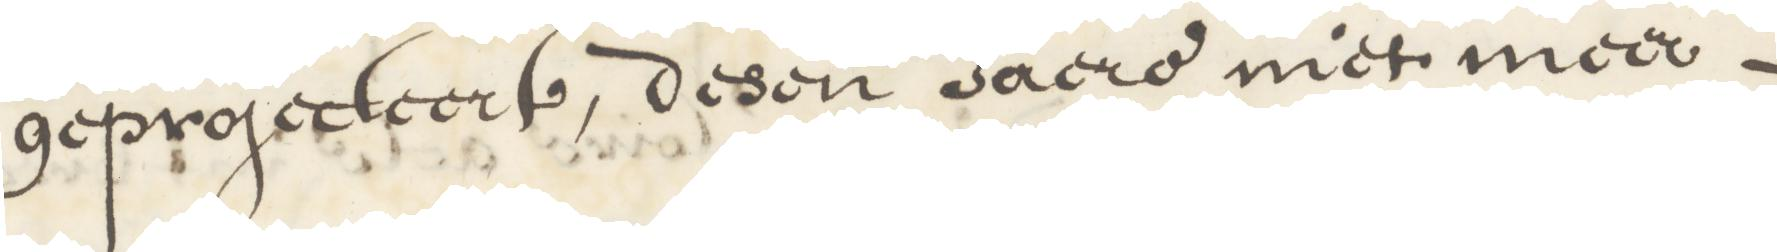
geprojecteert, desen Iaere niet meer
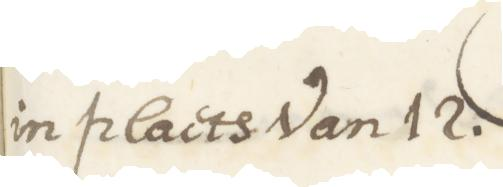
in plaets van 12.
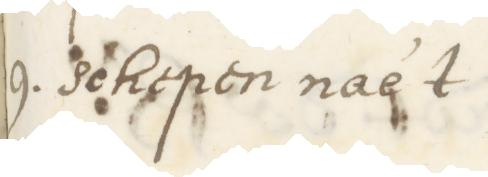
9. schepen nae ’t
